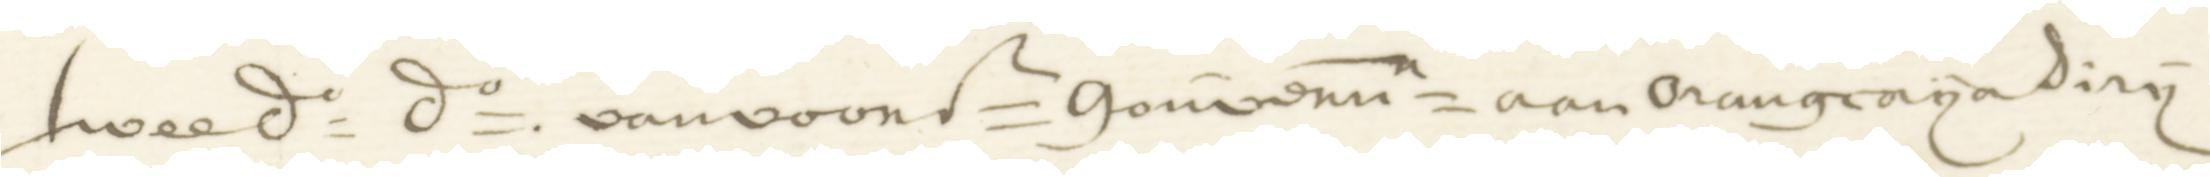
twee d=o d=o. van voors=' gouvern=r aan Orangcaijasirij
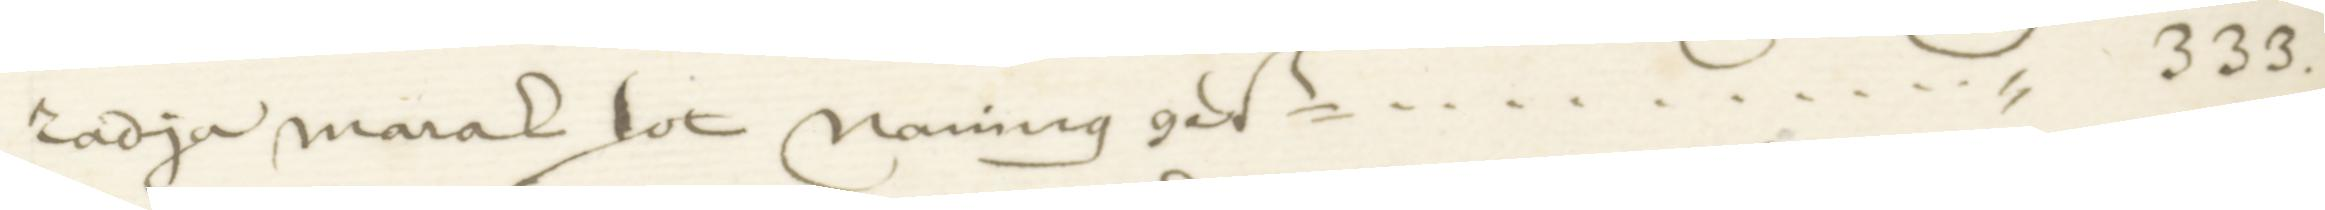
radja marah tot Naning ges=' . . . . . . . . . . „ 333.
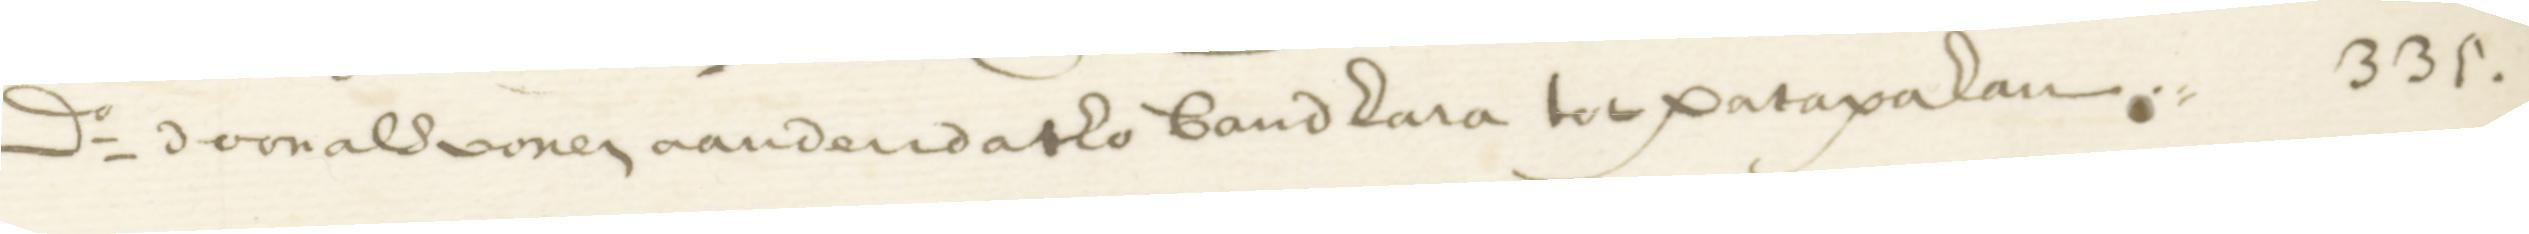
D=o door als voren aan den datho bandhara tot patapahan.„ 335.
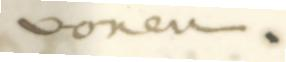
voren.
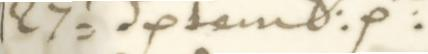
27=' Sptemb: p:r
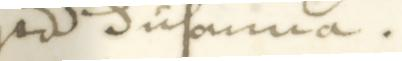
de Susanna.
